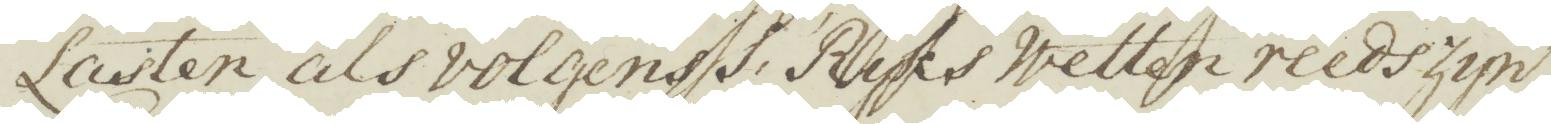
Lasten als volgens S, Ryks Wetten reeds zyn
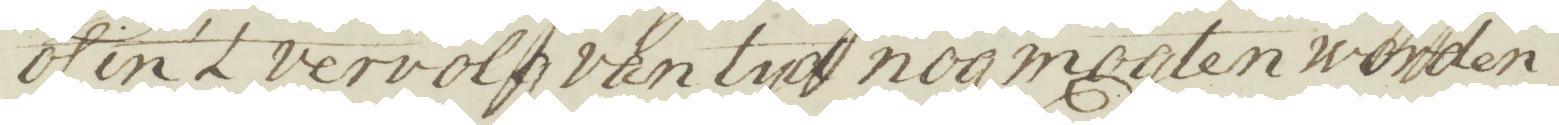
of in ’t vervolg van tyd nog mogten worden
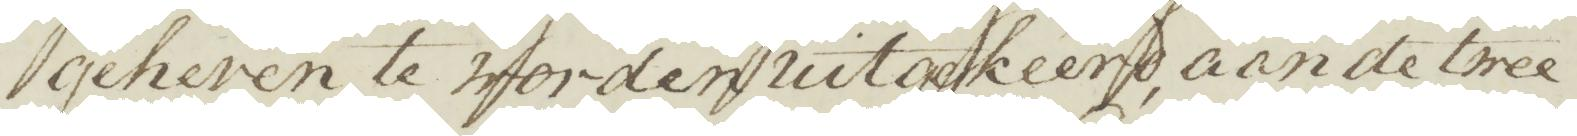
geheven, te worden uitgekeerd, aan de twee
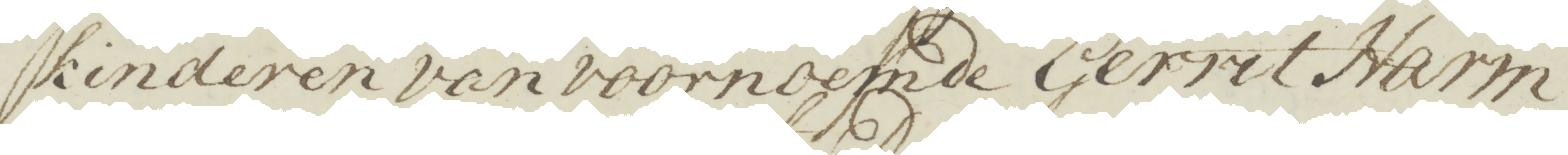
kinderen van voornoemde Gerrit Harm
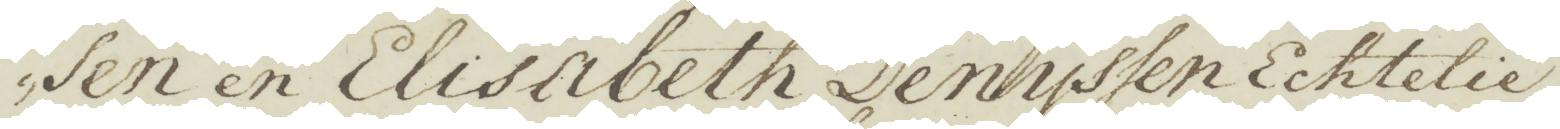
„sen en Elisabeth Denyssen Echtelie
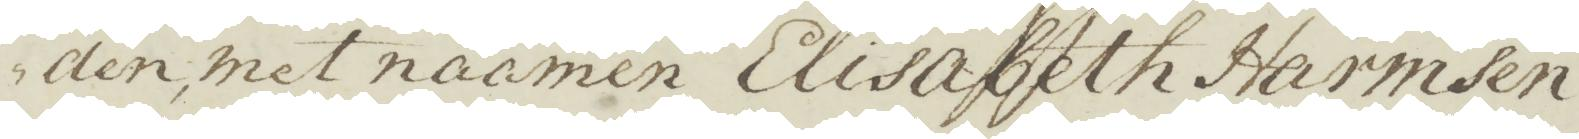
„den met naamen Elisabeth Harmsen
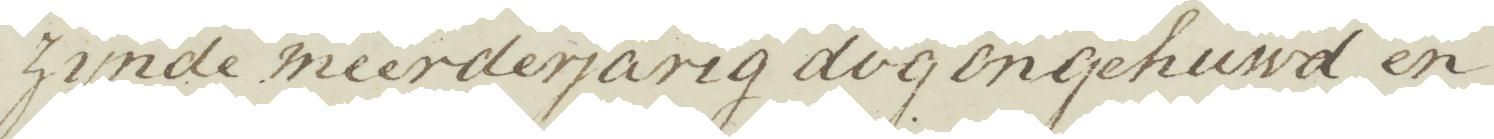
zynde meerderjarig dog ongehuwd en
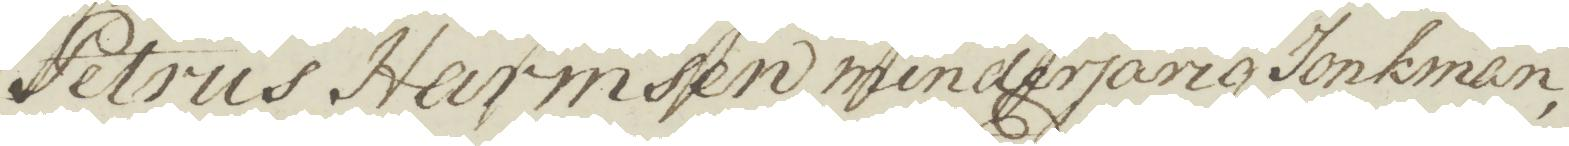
Petrus Harmsen, minderjarig Ionkman,
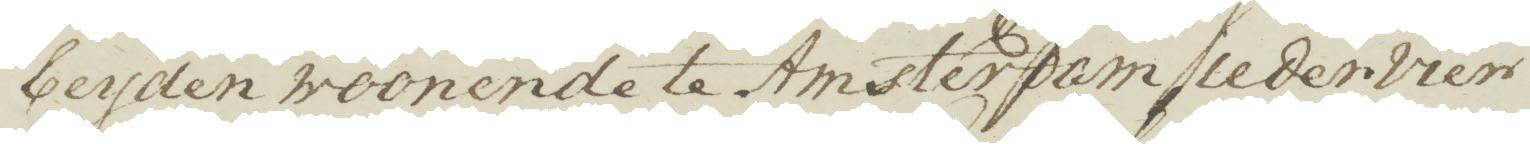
beyden woonende te Amsterdam ieder vier
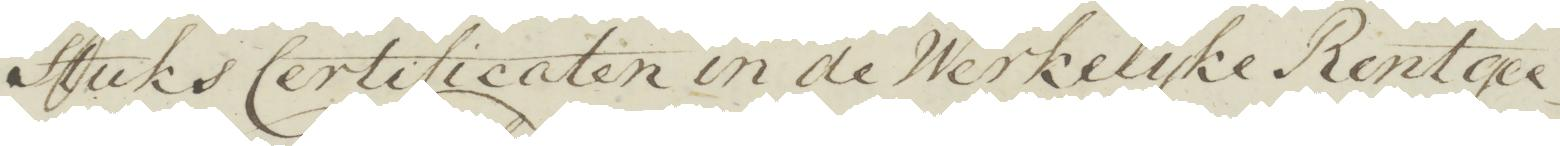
stuks Certificaten in de Werkelyke Rentgee„
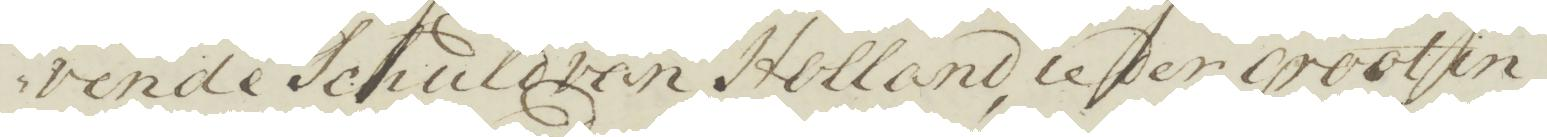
„vende Schuld van Holland, ieder groot in
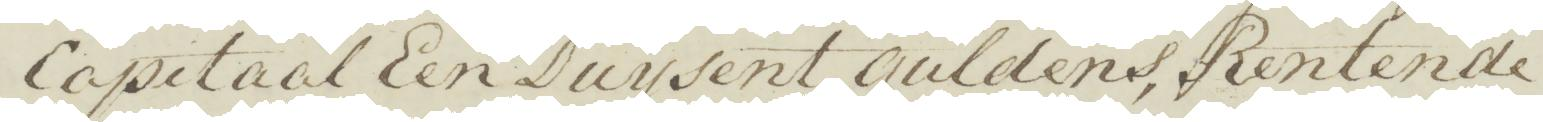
Capitaal Een Duysent guldens, Rentende
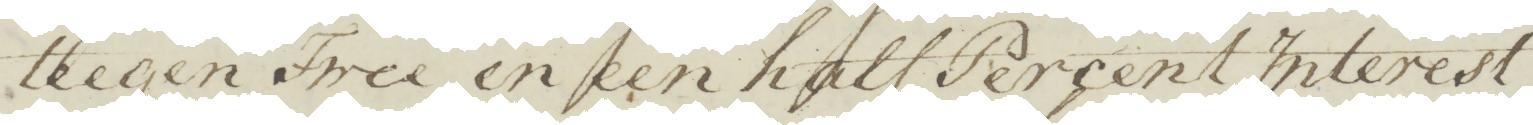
teegen Twee en een half Percent Jnterest
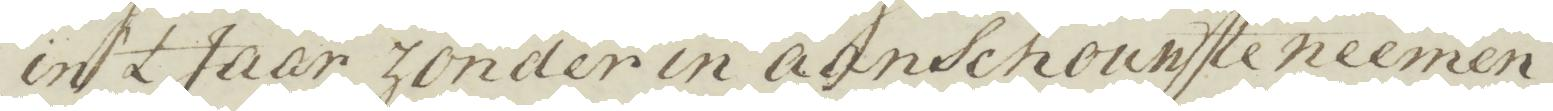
in ’t jaar zonder in aanschouw te neemen
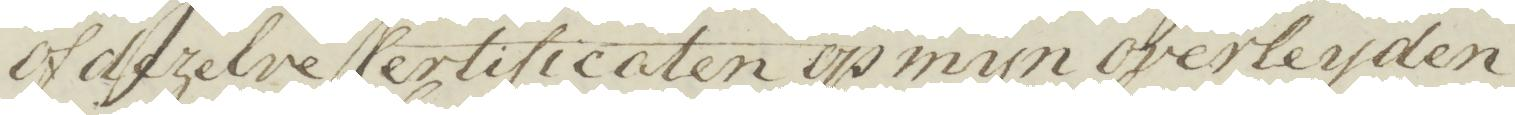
of dezelve Certificaten op myn overleyden
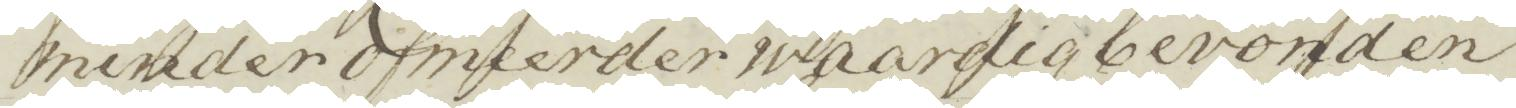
minder of meerder waardig bevonden
